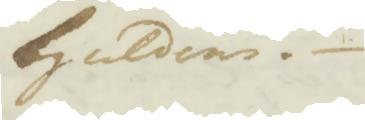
Guldens. —
